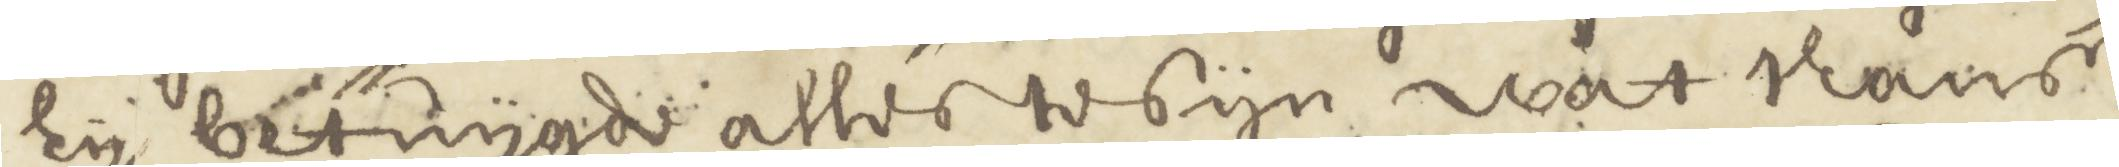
hij betuijgde alles te sijn wat thans
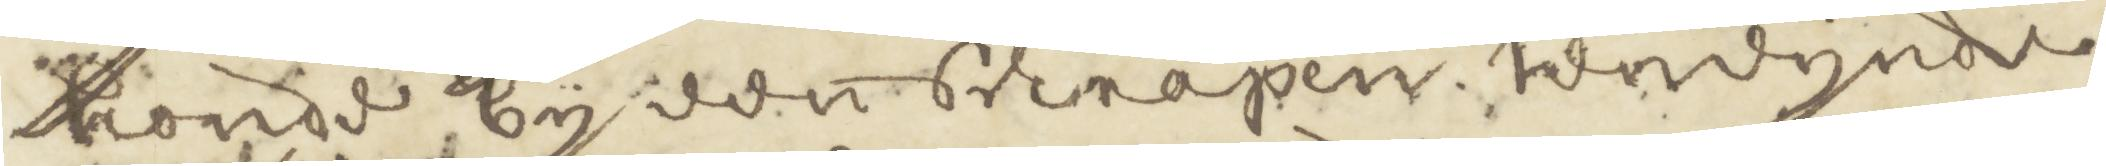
konde bij een schrapen ten eijnde
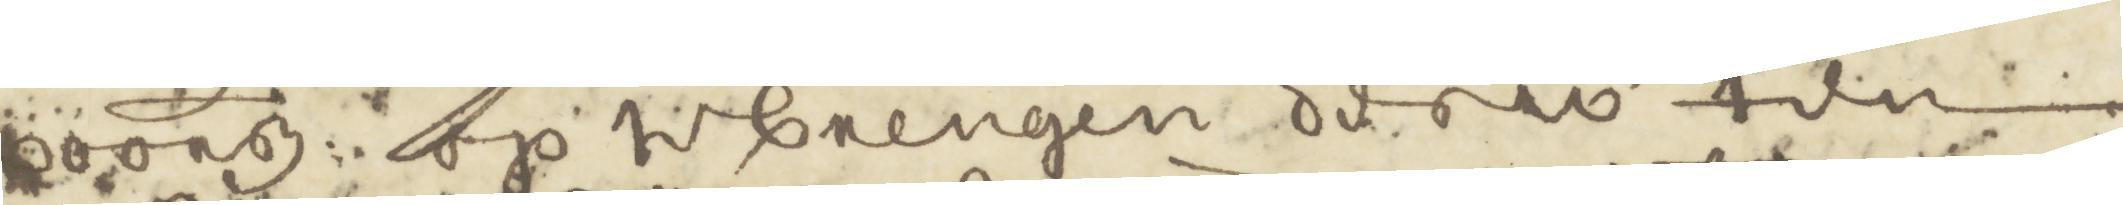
voorsz: op te brengen des w' ten
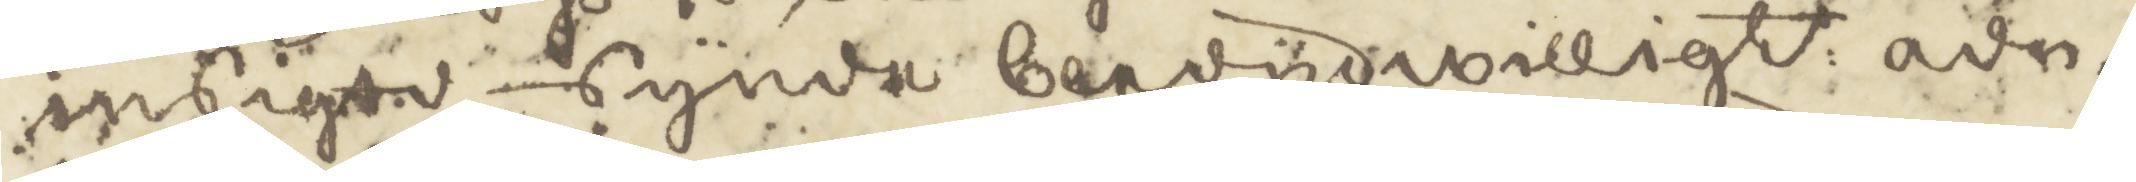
insigte sijner bereijdwilligh:t aen„
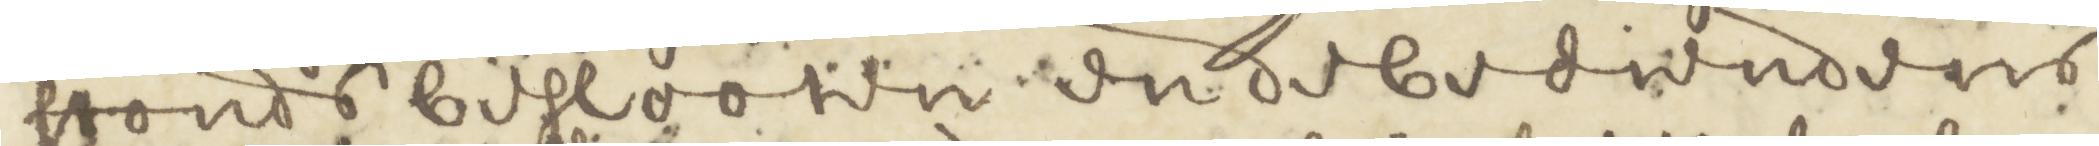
stonds beslooten en de bediendens
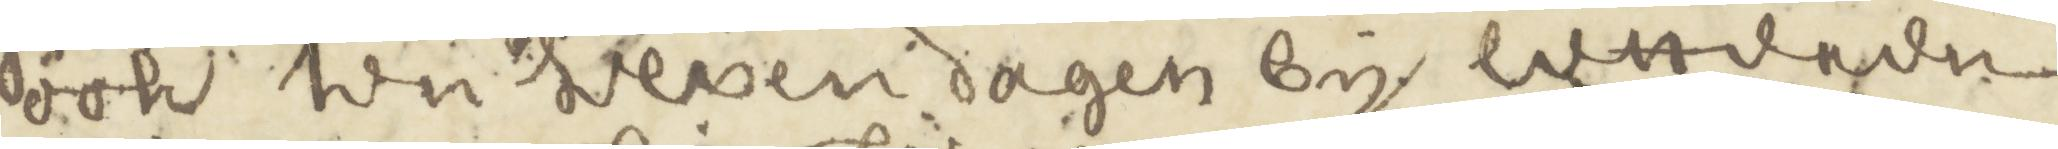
ook ten selven dagen bij letteren
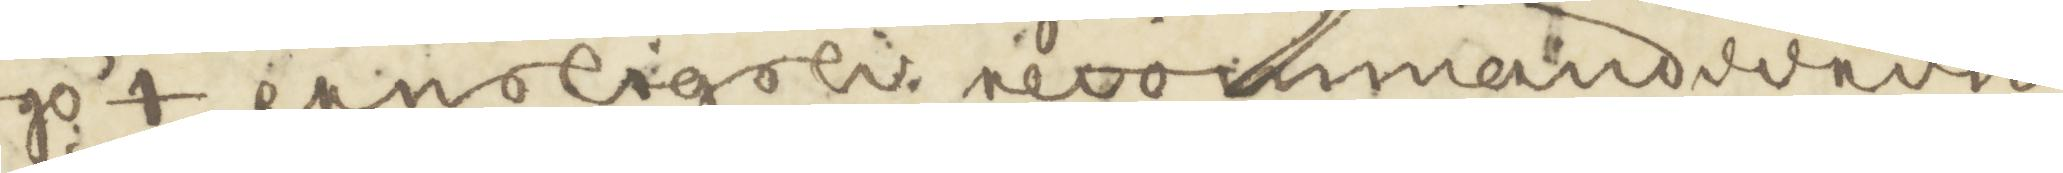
op't ernstigste recommandeeren
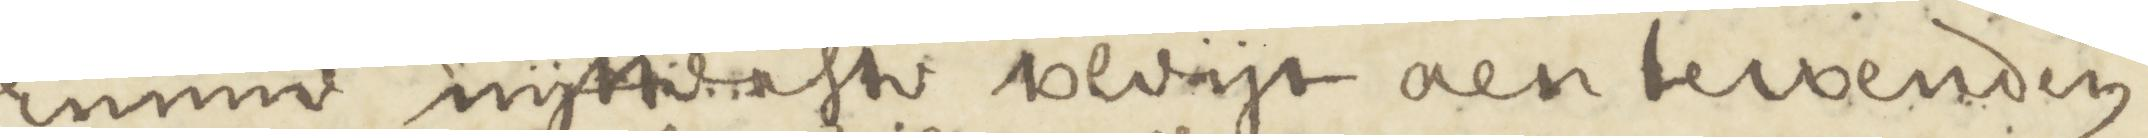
hunne uijtterste vleijt aen te wenden
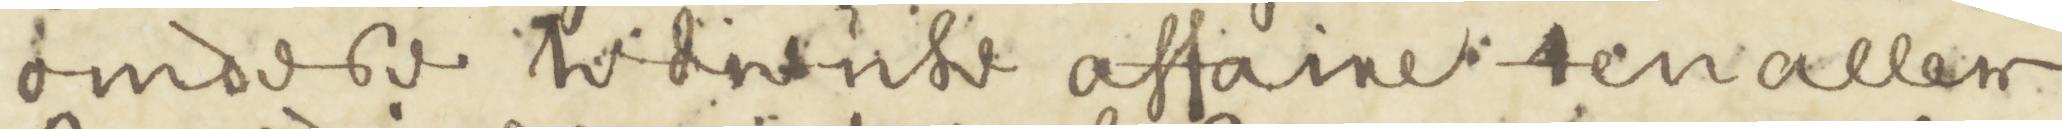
om dese te dieuse affaire ten aller
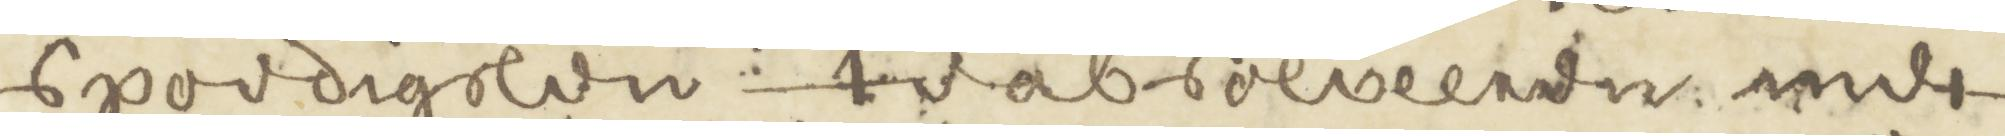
spoedigsten te absolveeren met
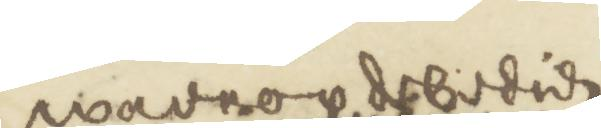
waerop de bedien
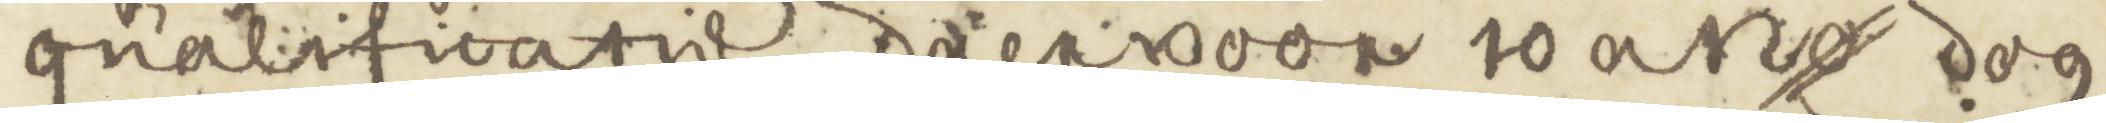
qualificatie daervoor 10 a 12 Ø dog
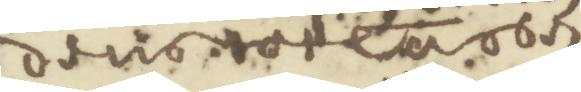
dens tot Caos en
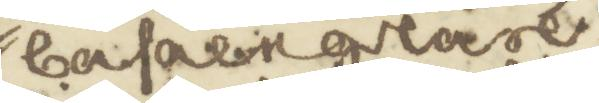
basaer gelast
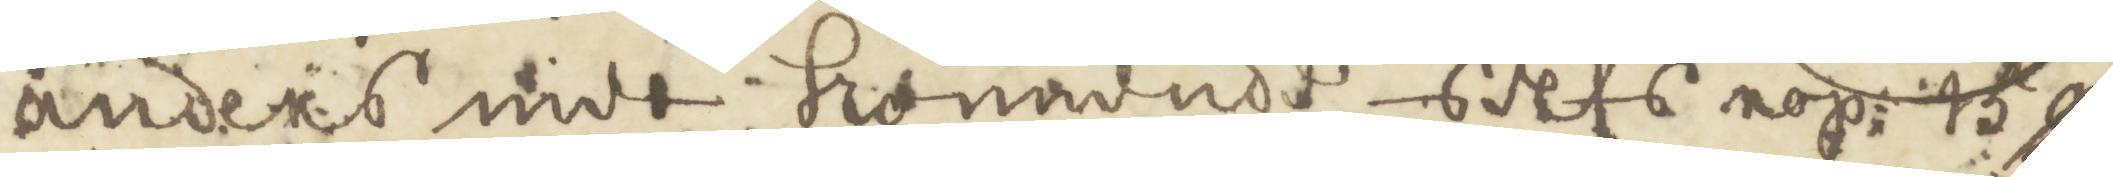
anders niet konnende selfs rop: 15 Ø.
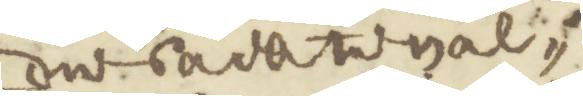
die saek ten al„
